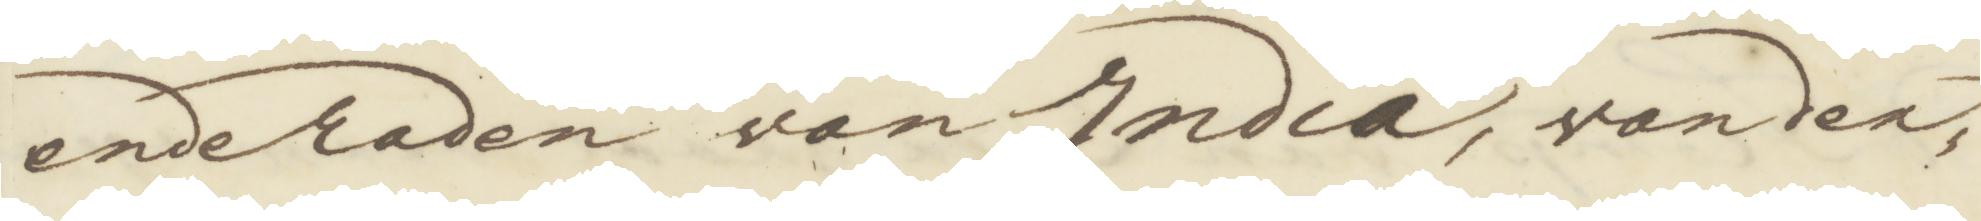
ende raden van Jndia, van der„
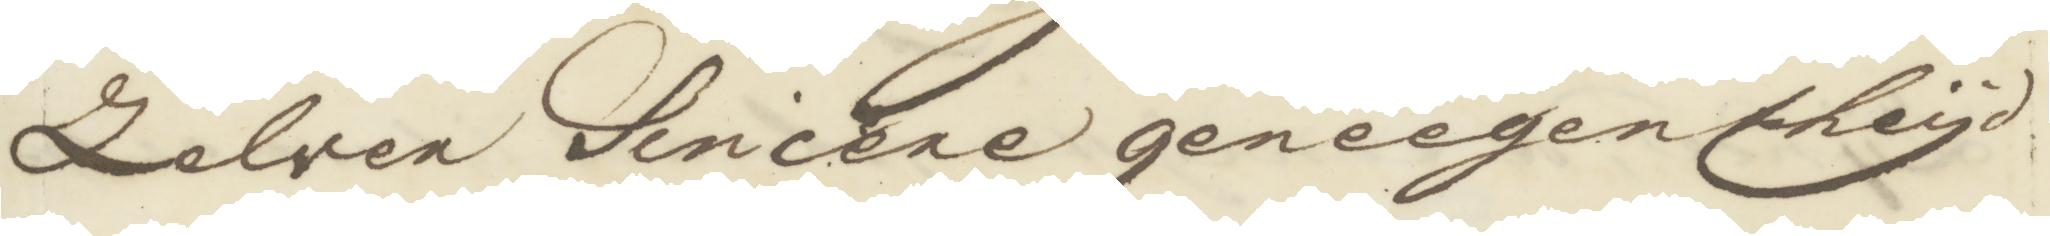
zelver sincere geneegentheijd.
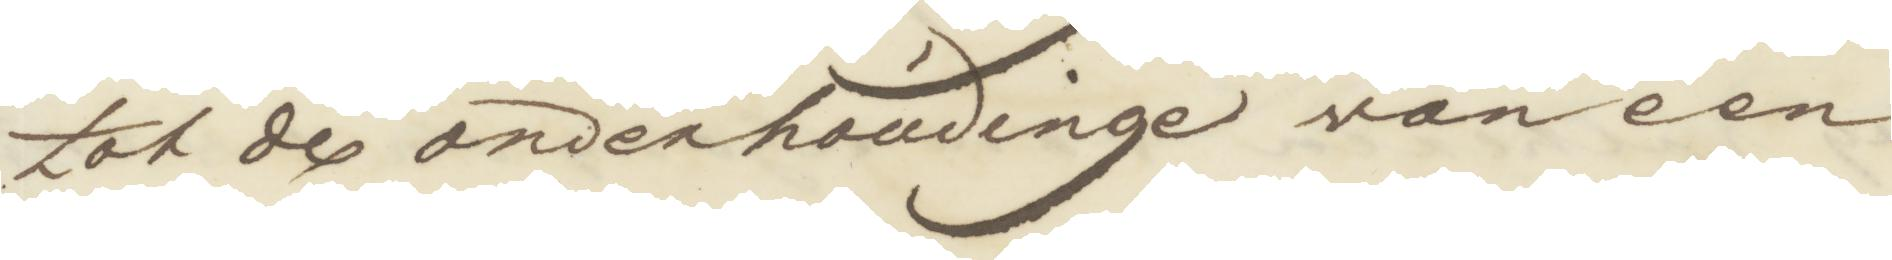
tot de onderhoudinge van een
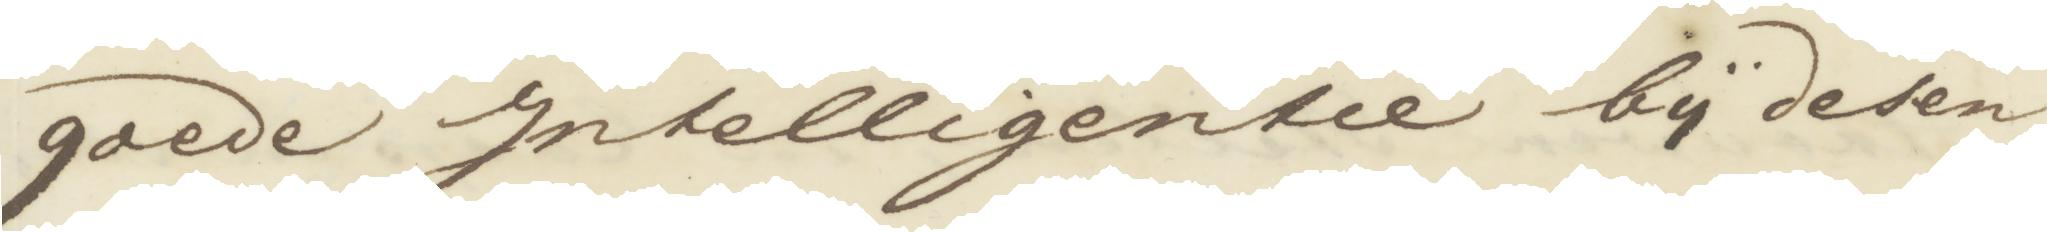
goede Jntelligentie bij desen
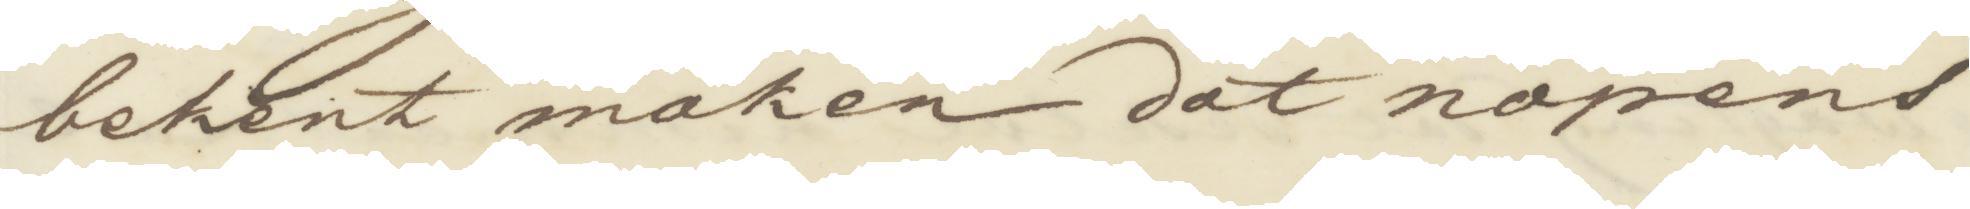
bekent maken dat nopens
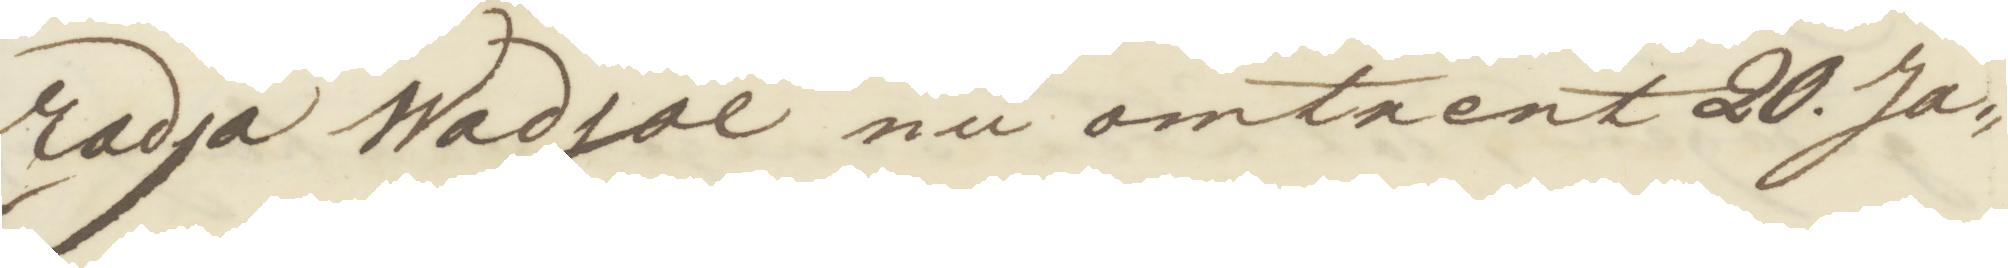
radja Wadjoe nu omtrent 20. Ja„
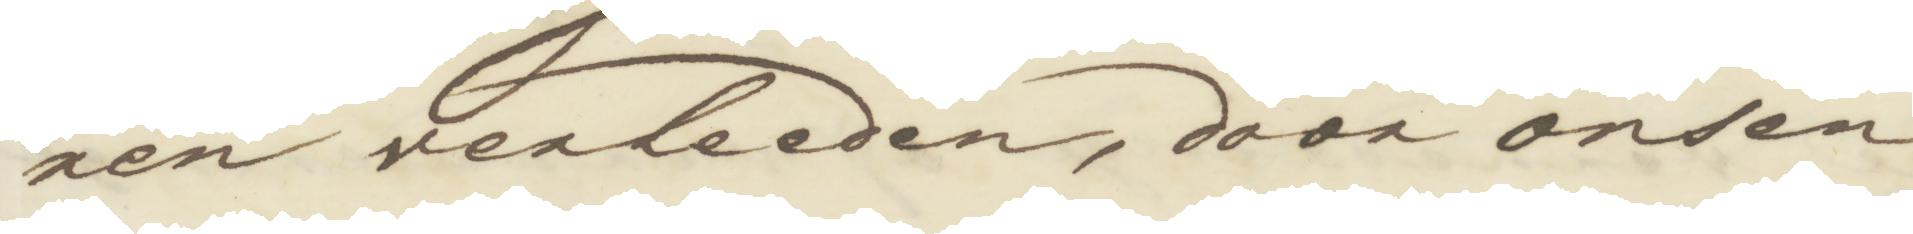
ren verleeden, door onsen
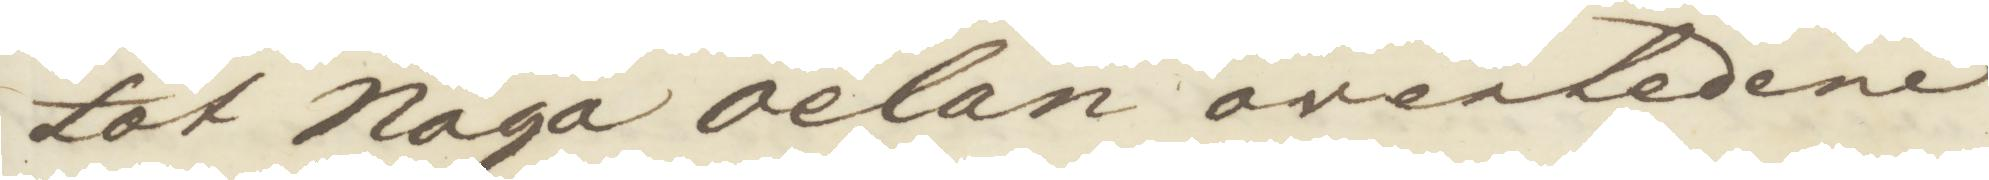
tot Naga oelan overledene
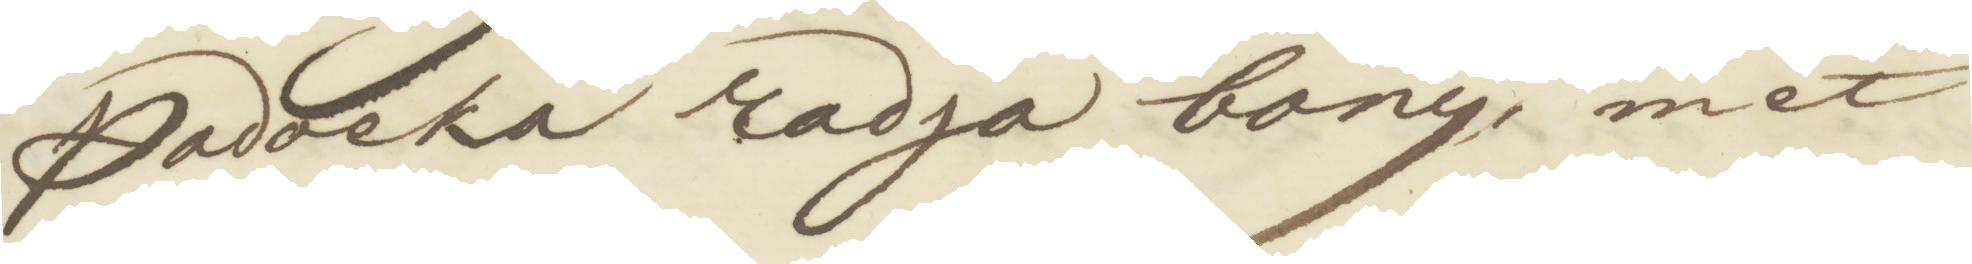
Padoeka radja bonij, met
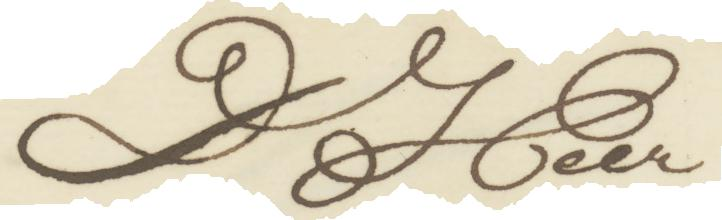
D Heer
